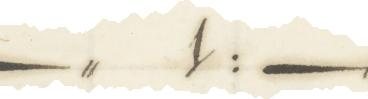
— „1: —
